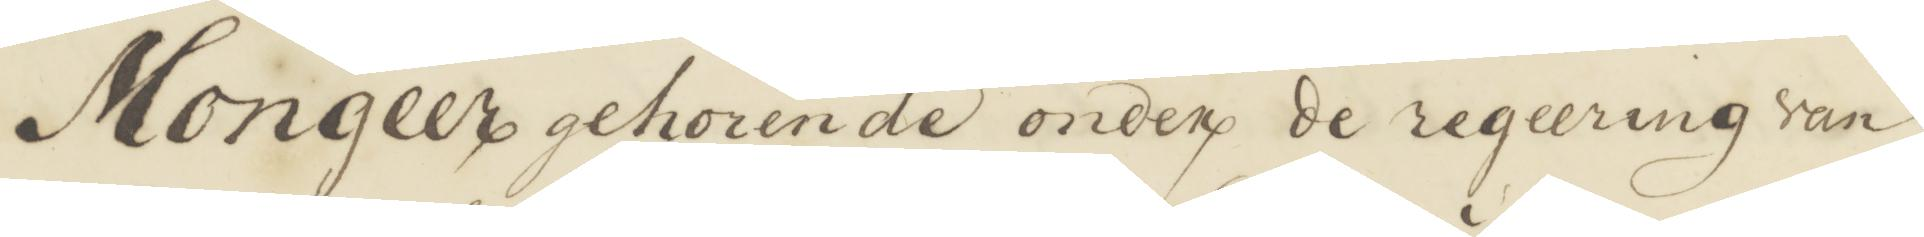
Mongeer gehorende onder de regeering van
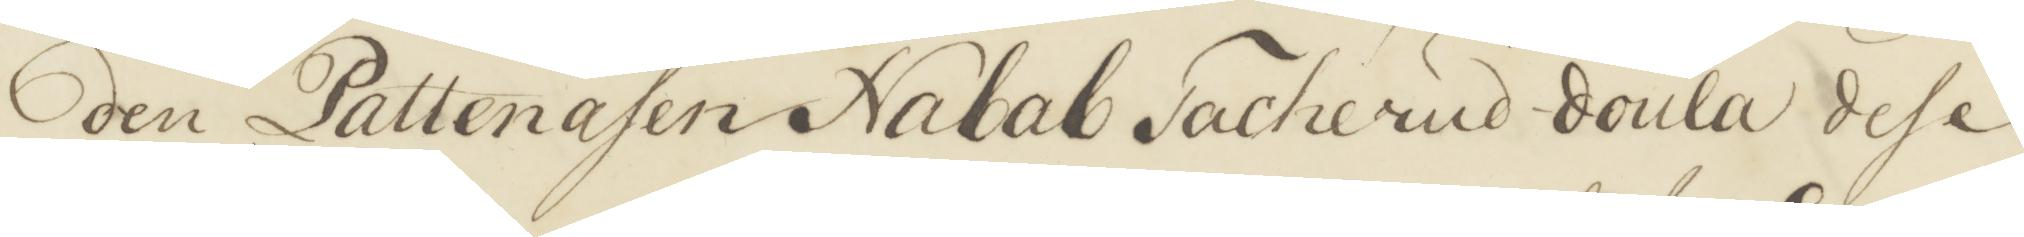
den Pattenasen Nabab Tacherud doula dese
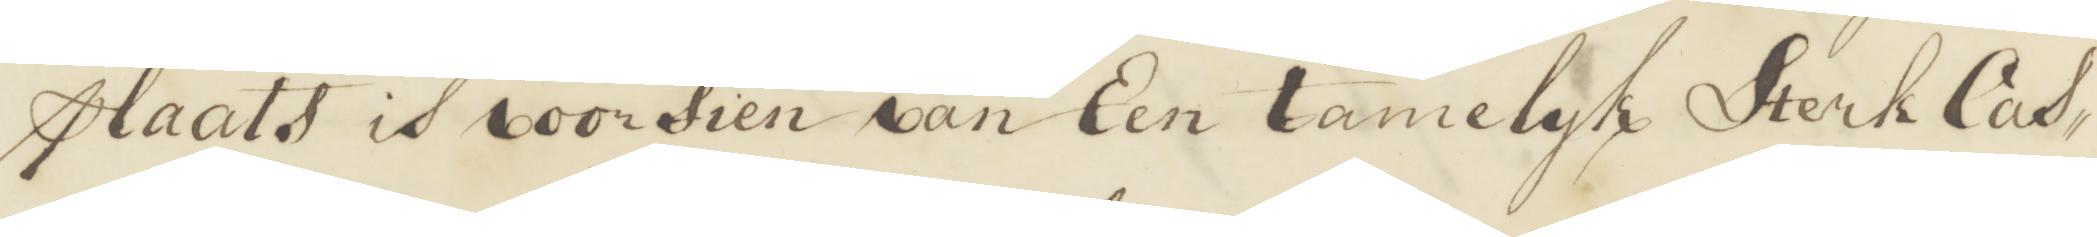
plaats is voorsien van Een tamelijk Sterk Cas„
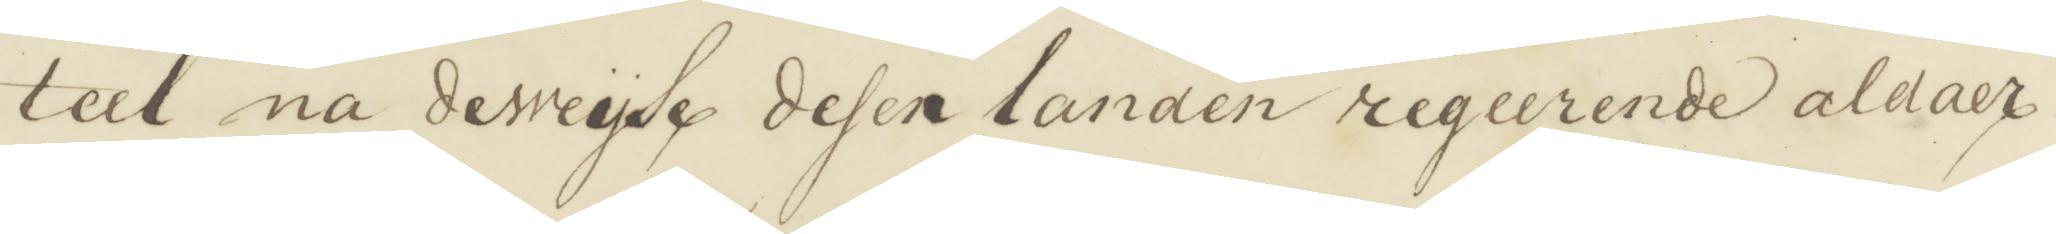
teel na deweijse desen landen regeerende aldaer
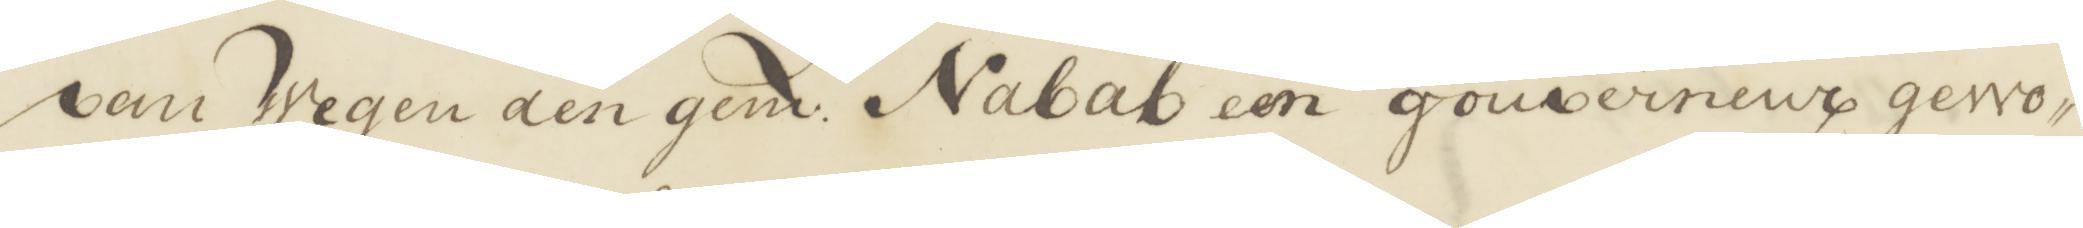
van wegen den gem: Nabab een gouverneur gewo„
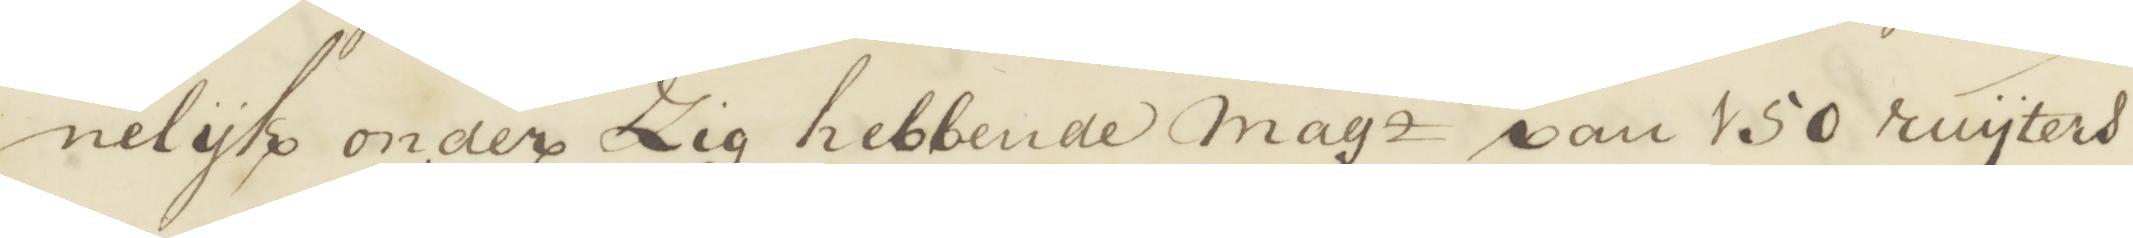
nelijk onder zig hebbende magt van 150 ruijters
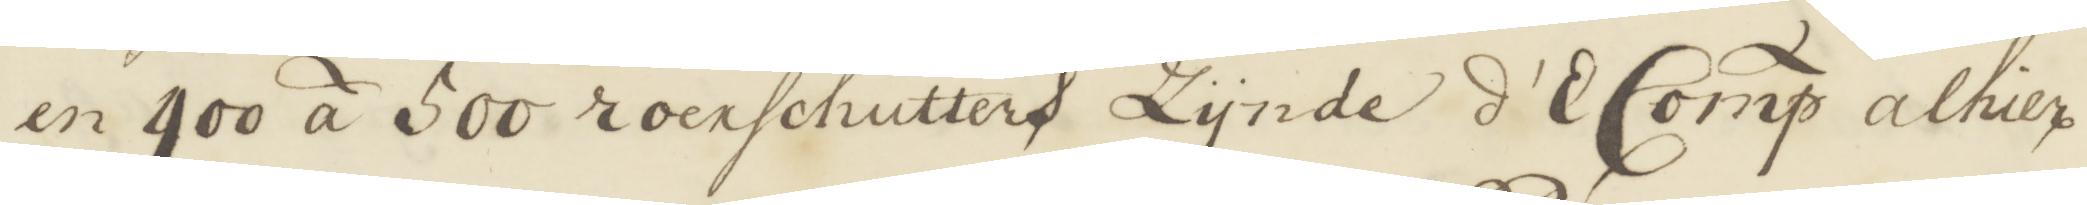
en 400 a 500 roerschutters zijnde d’E Comp alhier
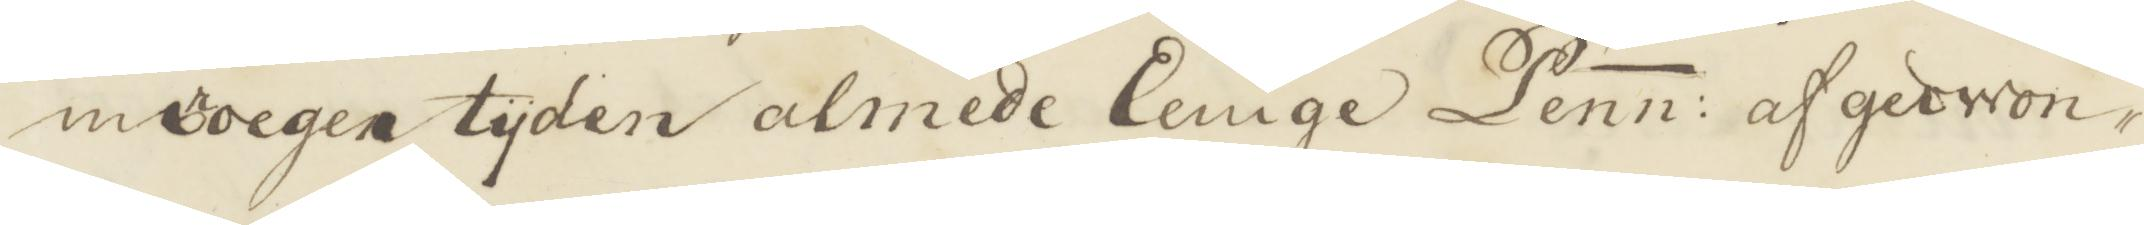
invroeger tijden almede Eenige Penn: afgedwon„
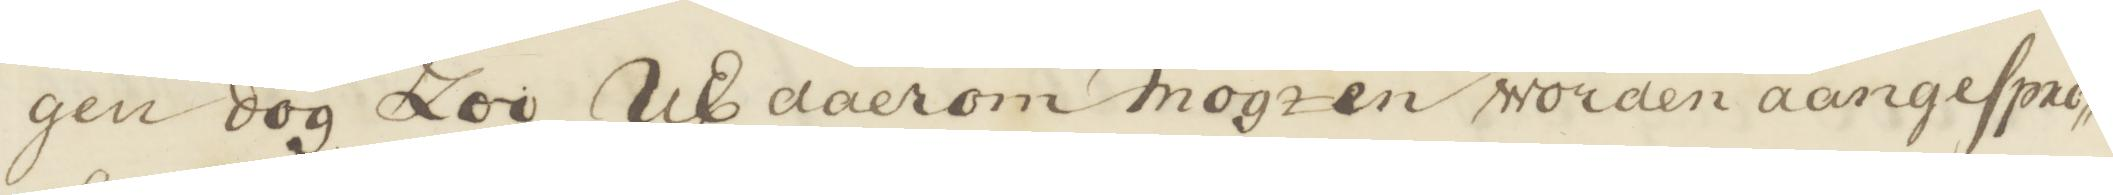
gen dog zoo UE daerom mogten worden aangespro„
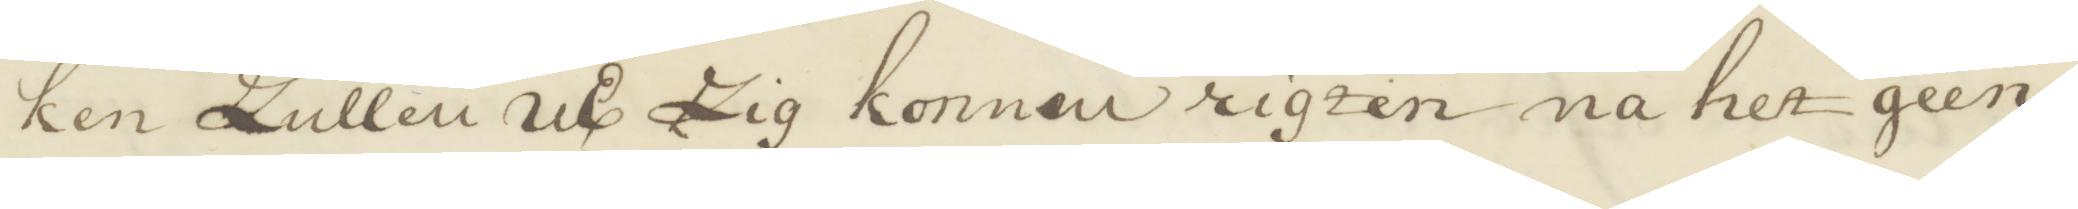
ken zullen uE zig konnen rigten na het geen
